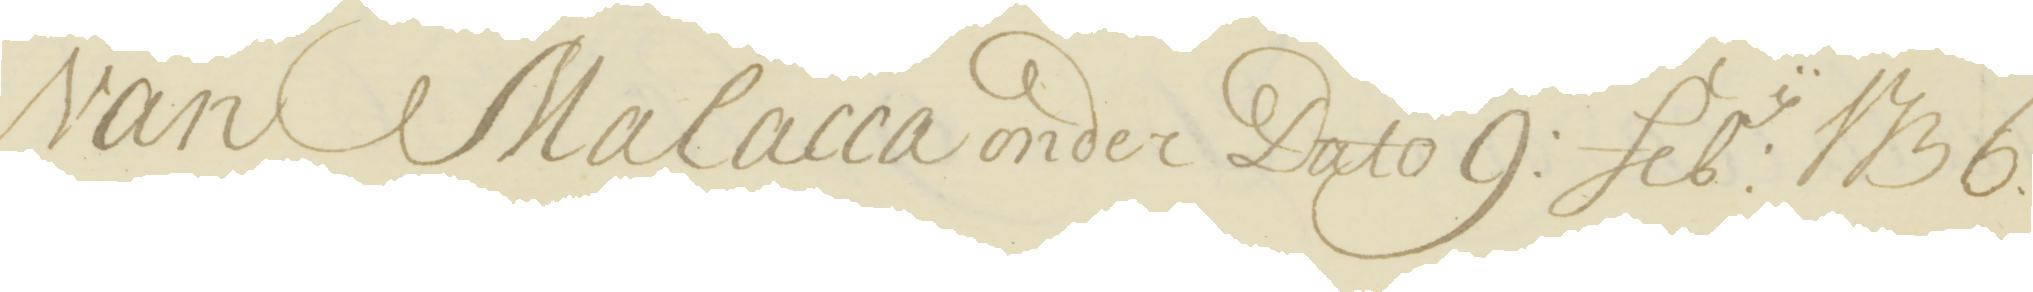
Van Malacca onder Dato 9:' feb:rij 1736.
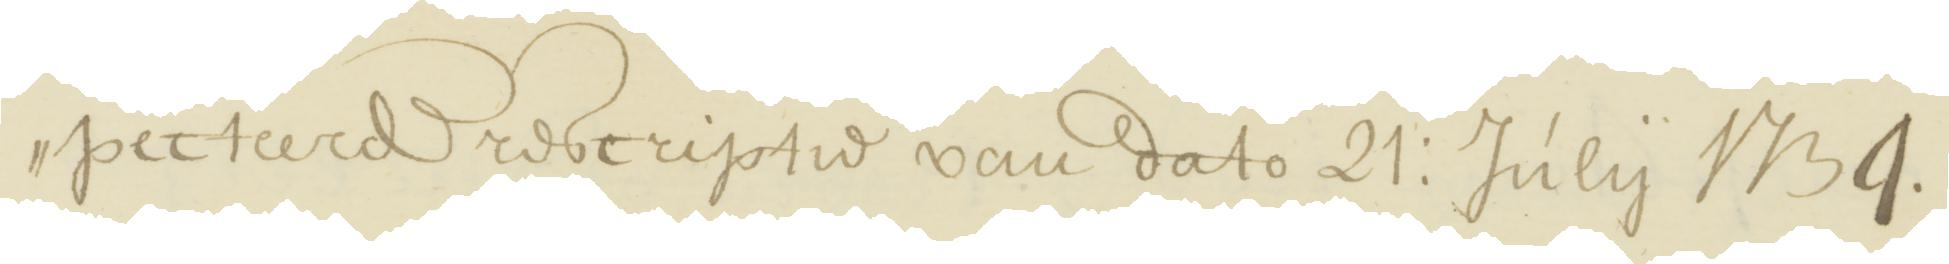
„pecteerde rescriptie van dato 21:' Julij 1734.
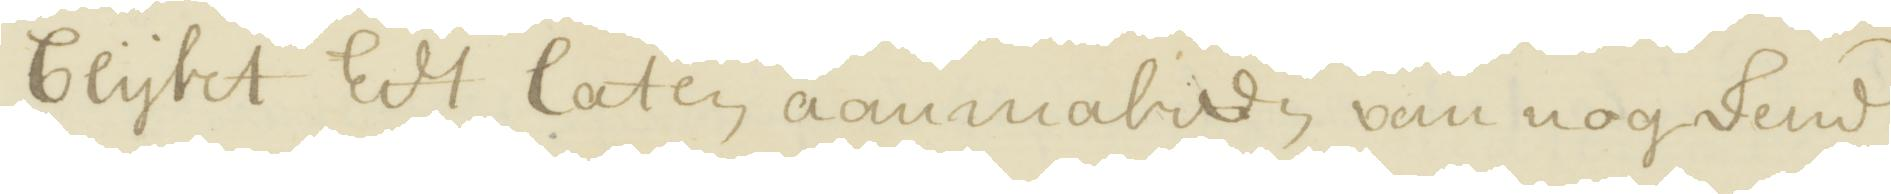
blijkt het laten aanmaken van nog Eene
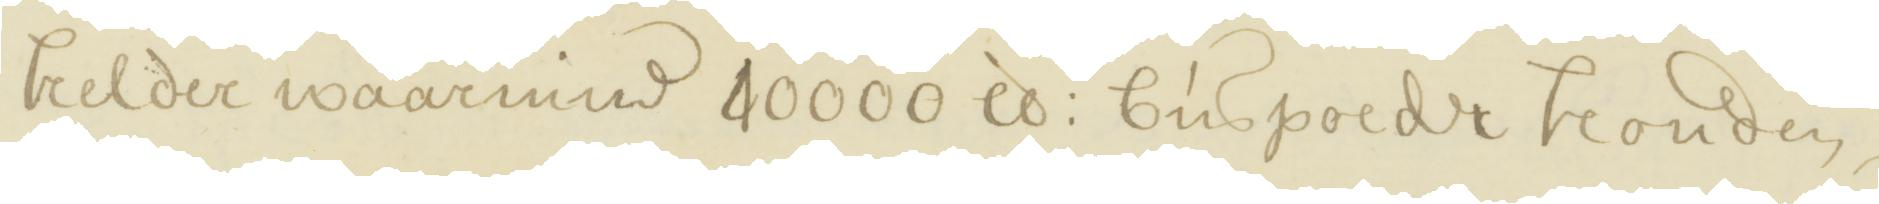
kelder waarinne 40'000 lb: buspoeder konden
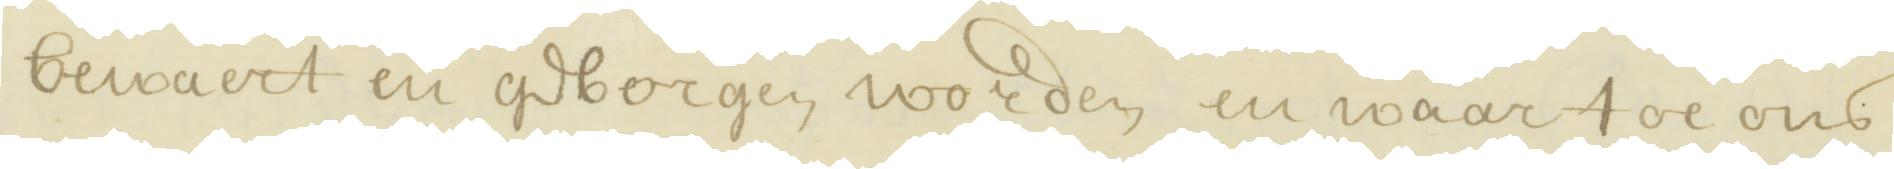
bewaert en geborgen worden en waar toe ons
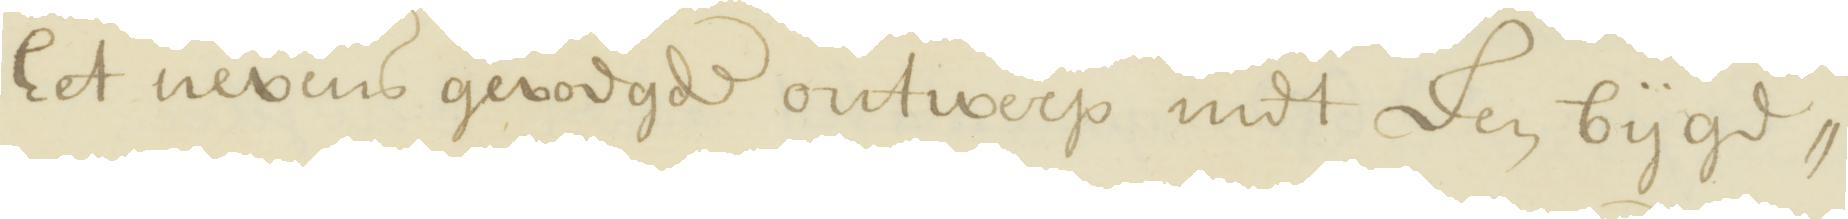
het nevens gevoegde ontwerp met Een bijge„
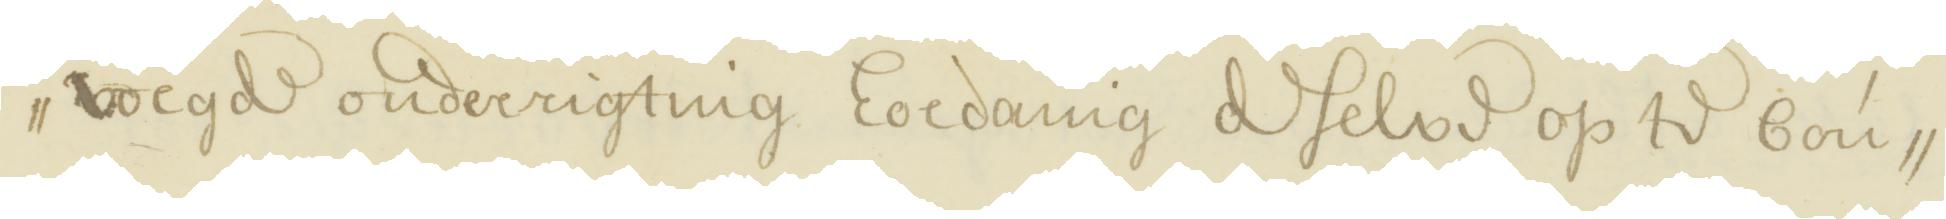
„voegde onderrigting hoedanig deselve op te bou„
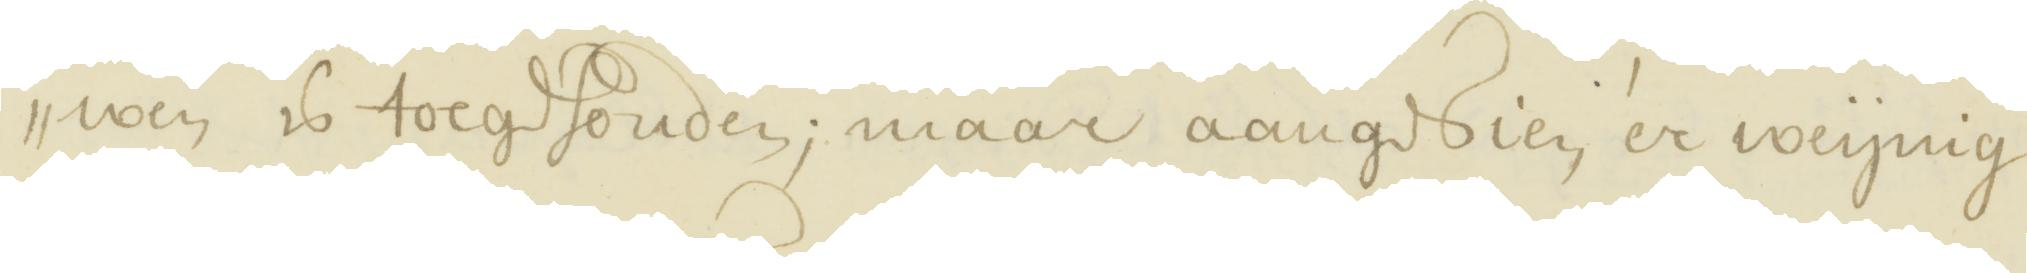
„wen is toegesonden; maar aangesien 'er weijnig
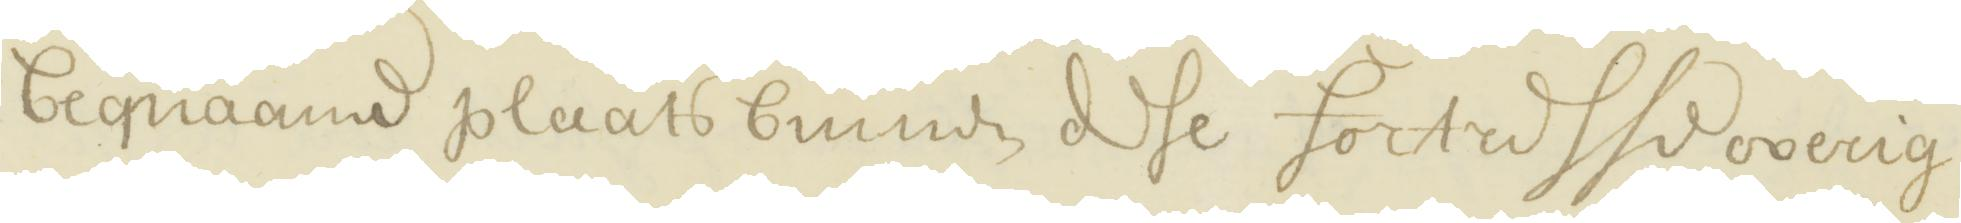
bequaame plaats binnen dese fortresse overig
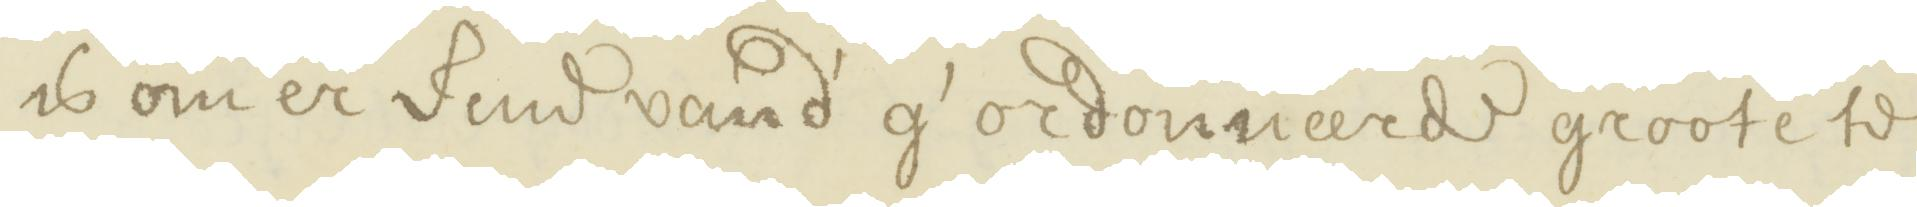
is om 'er Eene van d’ g’ordonneerde groote te
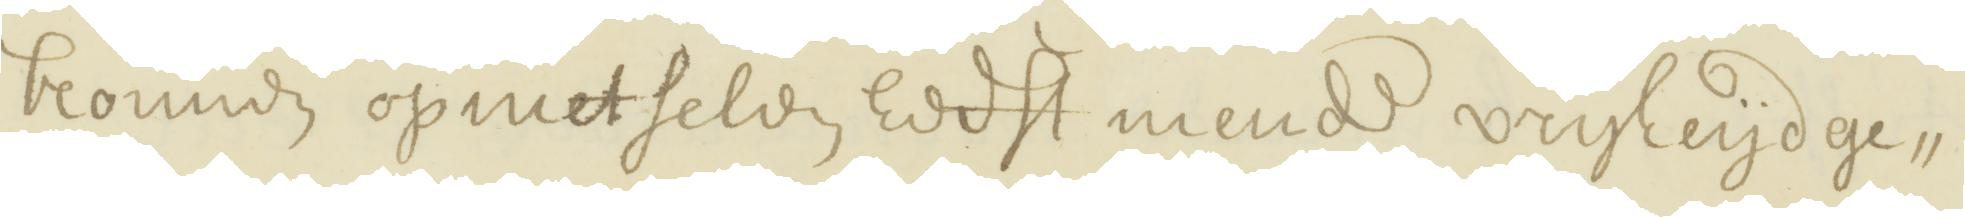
konnen opmetselen heeft men de vrijheijd ge„
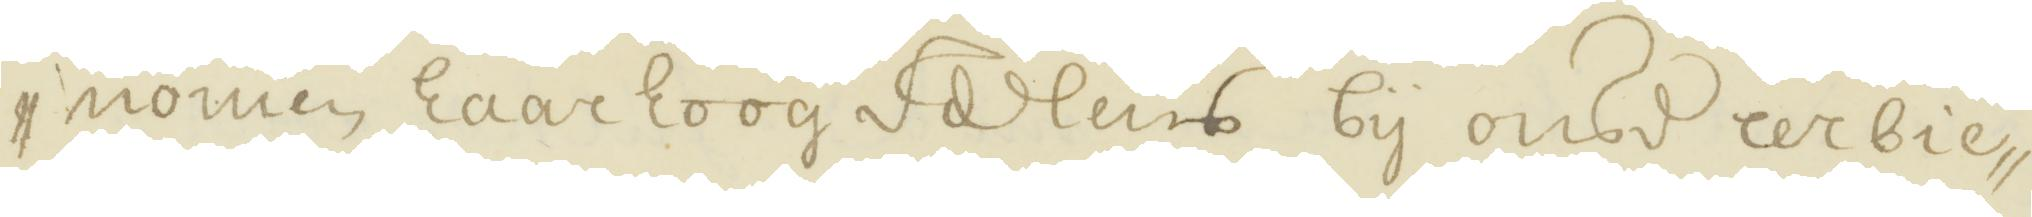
„nomen haar hoog Edelens bij onse eerbie„
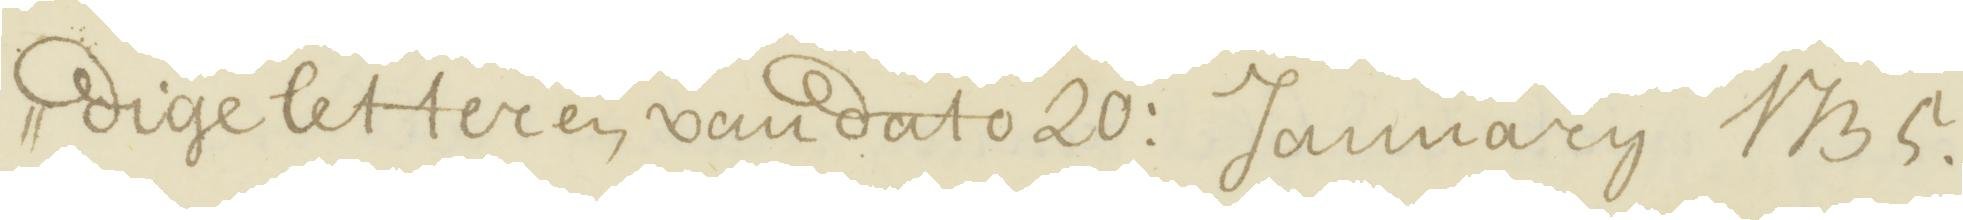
„dige letteren van dato 20:' Januarij 1735.
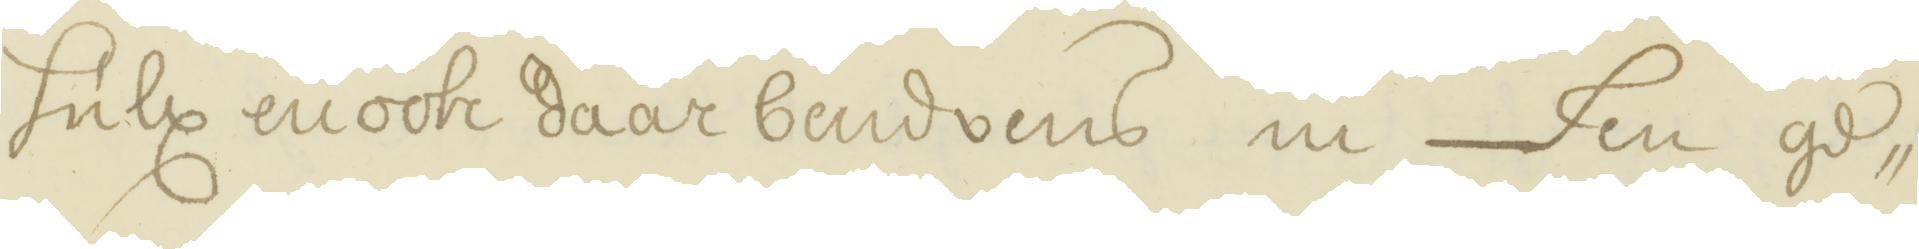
sulx en ook daar benevens in Een ge„
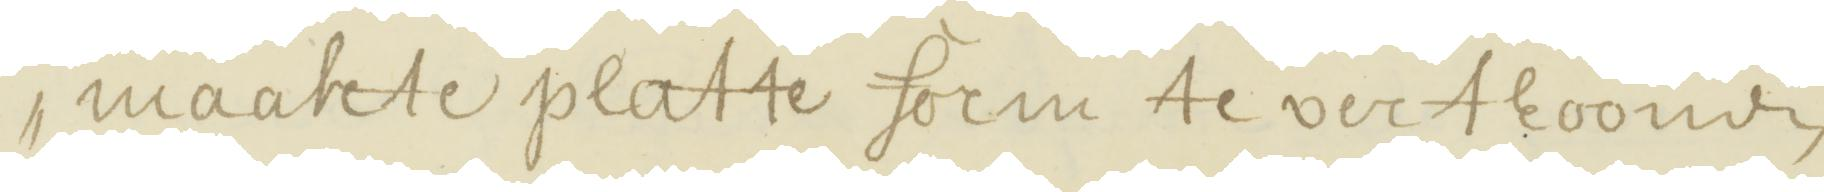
„maakte platte form te verthoonen
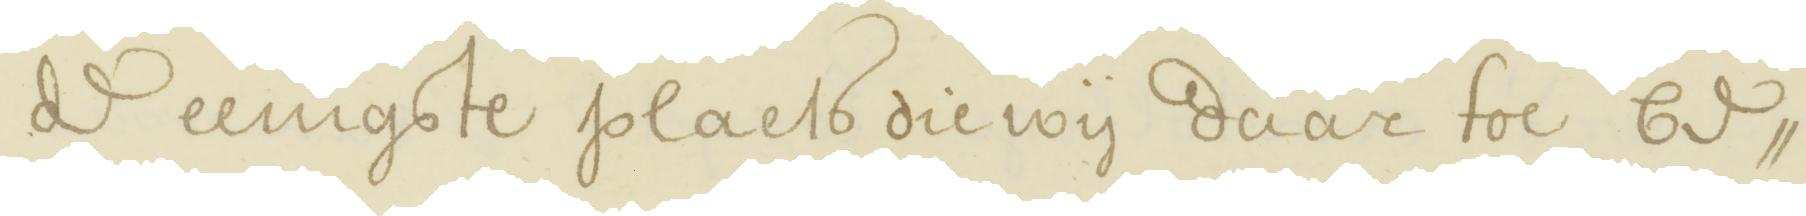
de eenigste plaets die wij daar toe be„
